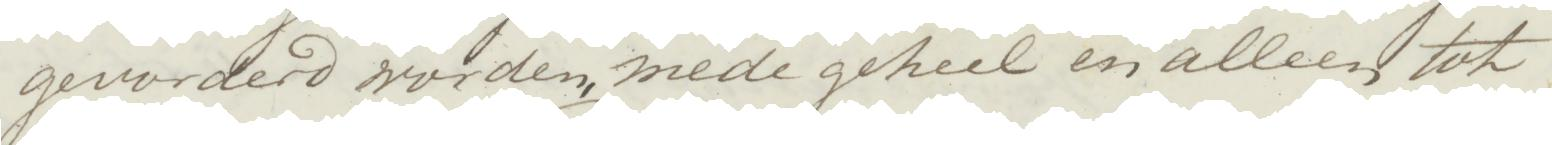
gevorderd worden, mede geheel en alleen tot
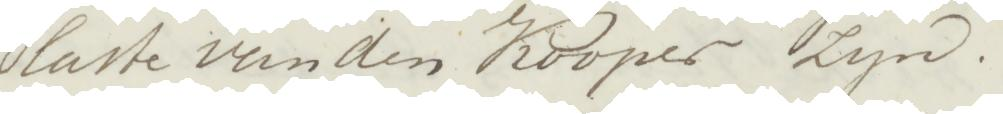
laste van den Kooper zyn.
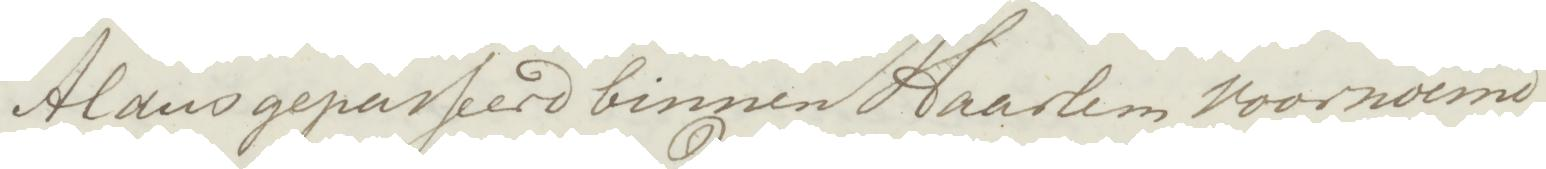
Aldus gepasseerd binnen Haarlem voornoemd,
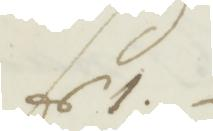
fr 1. —
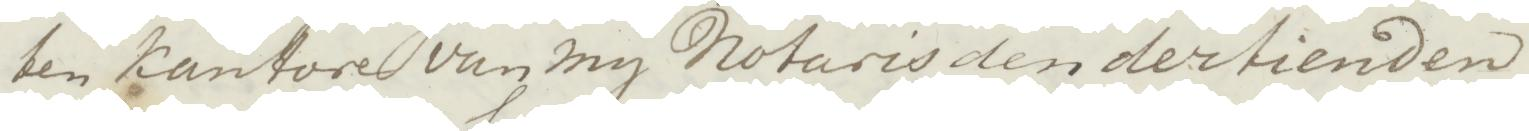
ten kantore van my Notaris den dertienden
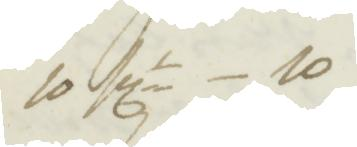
10 /c=t — 10
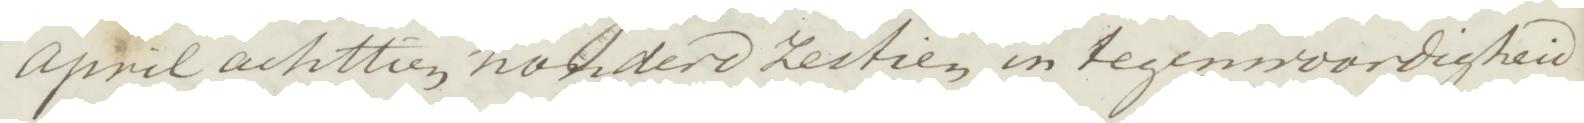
april achttien honderd zestien, in tegenwoordigheid
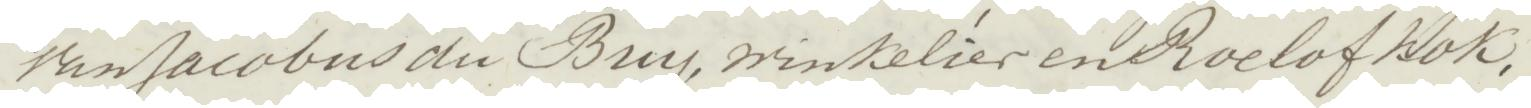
van Jacobus du Buy, winkelier en Roelof Kok,
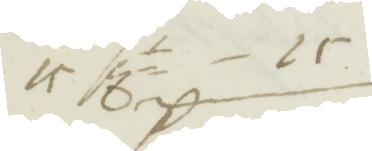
15 /c=t — 15.
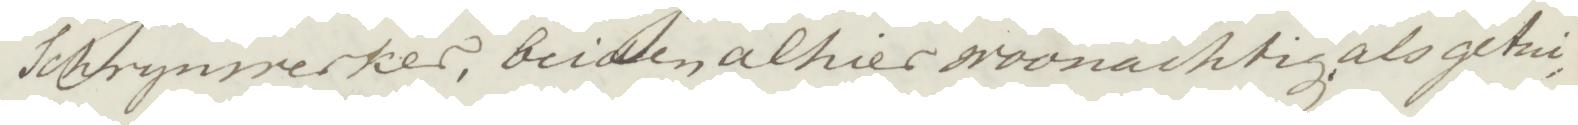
schrynwerker, beiden alhier woonachtig, als getui-
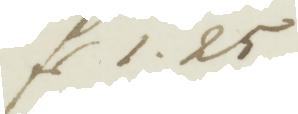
fr. 1.25
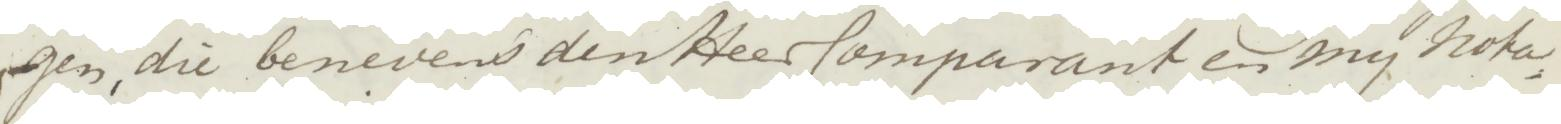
gen, die benevens den Heer Comparant en my nota=
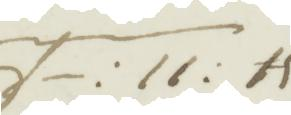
ƒ — : 11:15
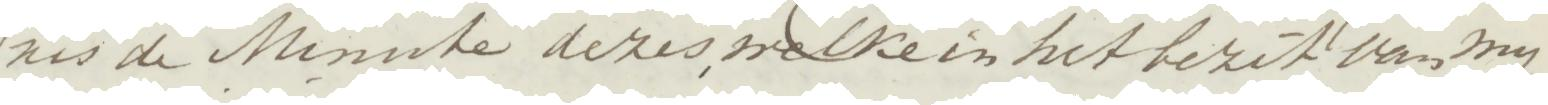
=ris de Minute dezes, welke in het bezit van my
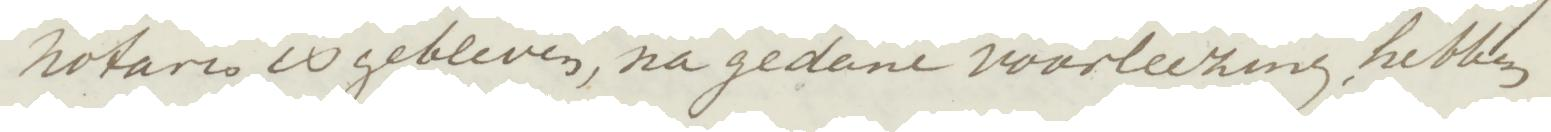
notaris is gebleven, na gedane voorleezing, hebben
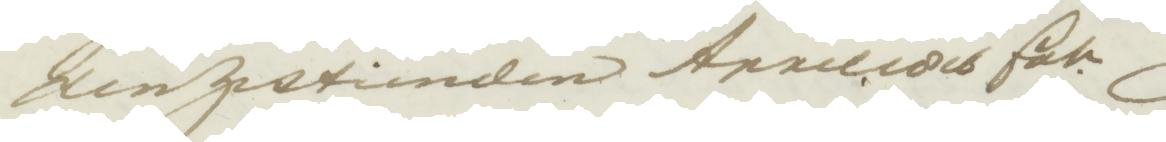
den zestienden April 1816 fol.o
